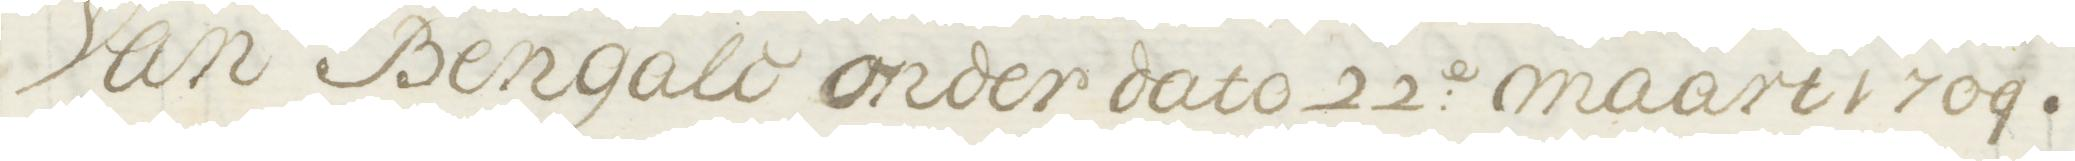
Van Bengale onder dato 22:e maart 1704.
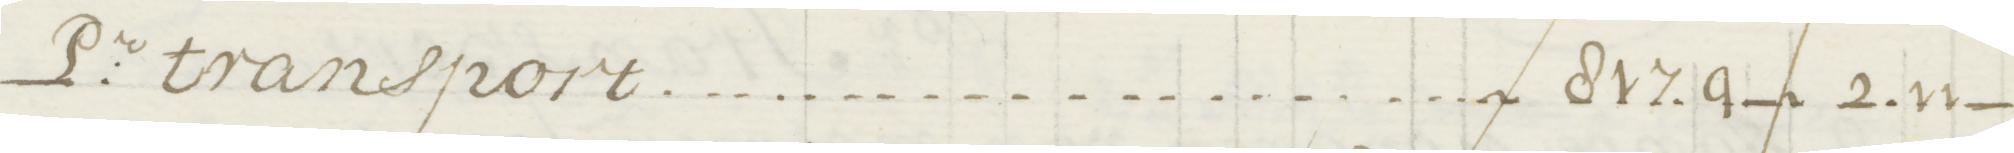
P:r transport - - - - - - - - - - - - - - - - - - - - - - ƒ817.4—ƒ 2.11.—
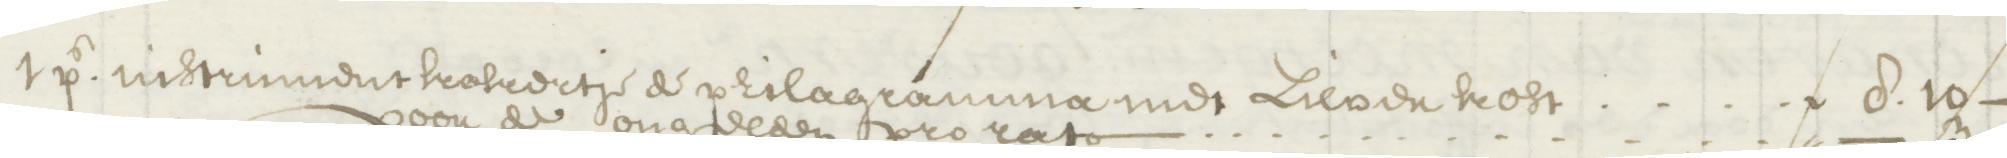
1 p.s instrument kokertje de philagramma met zilver kost - - - - ƒ 8.10—
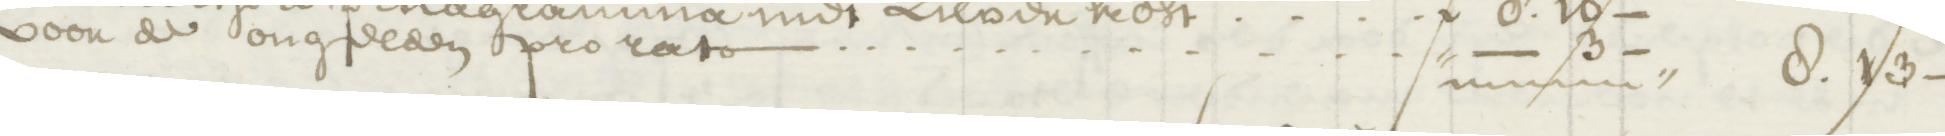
voor de ongelden pro rato - - - - - - - - - - - - „ — 3 „ 8. 13-
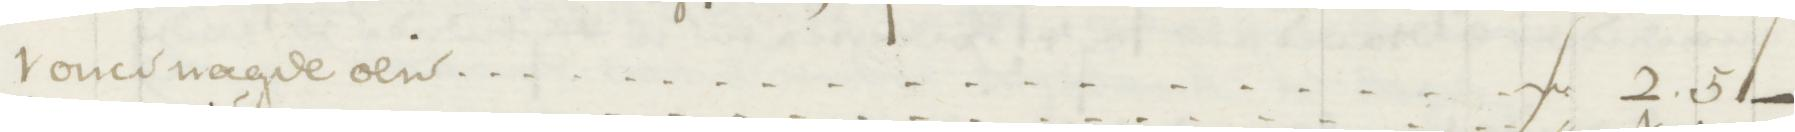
1 once nagel olie - - - - - - - - - - - - - - - - - - - ƒ 2.5 —
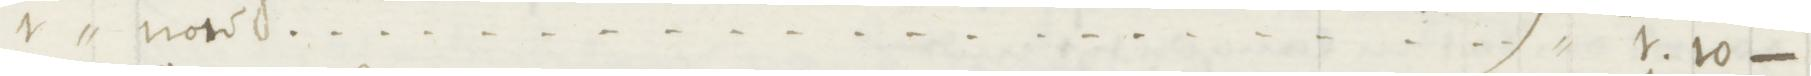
1 „ note - - - - - - - - - - - - - - - - - - - - - - „ 1.10 —
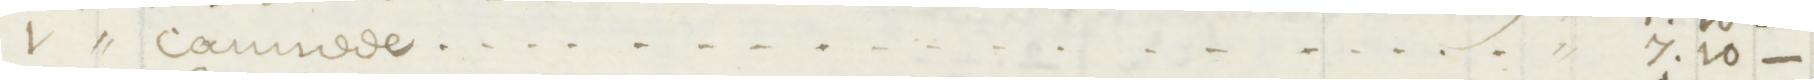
1 „ canneel - - - - - - - - - - - - - - - - - - - „ 7. 10 —
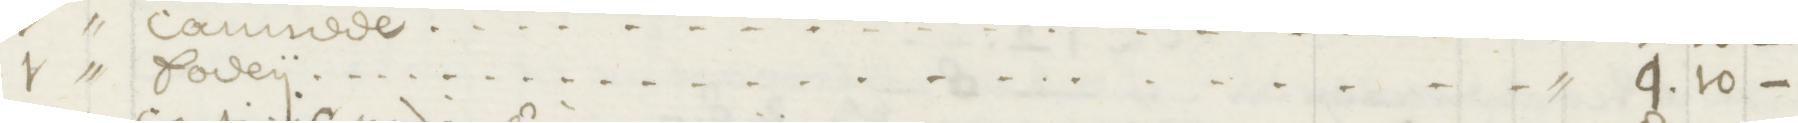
1 „ foelij - - - - - - - - - - - - - - - - - - - - - - - - „ 4.10 —
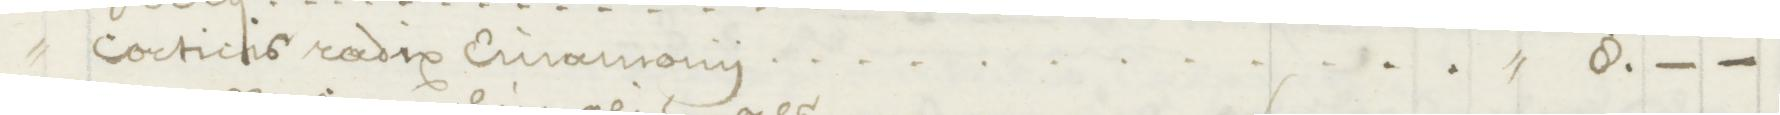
„ Corticis radix Cinamonij - - - - - - - - - - - - „ 8. — —
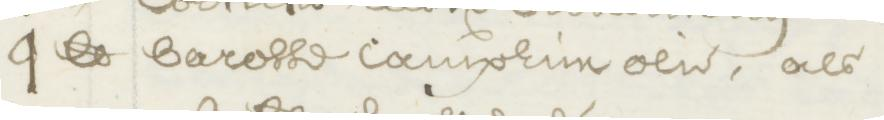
4 lb barosse camphur olie, als
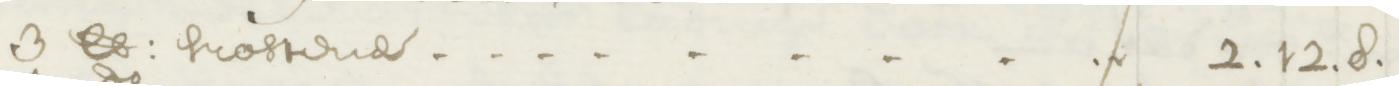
3 lb: kostende - - - - - - - - ƒ 2.12.8.
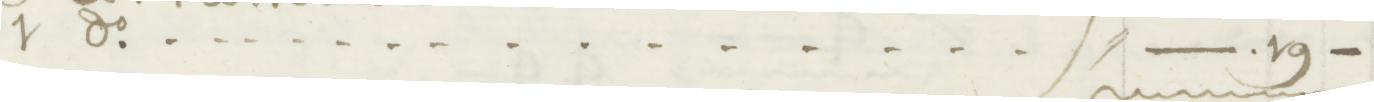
1 d.o - - - - - - - - - - - - - - „ —.19 -
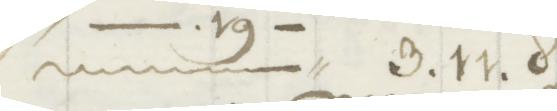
„ —.19 - „ 3. 11. 8
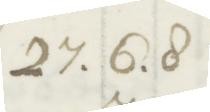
27. 6. 8
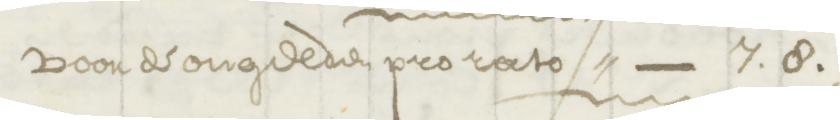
voor de ongelden pro rato „ —7. 8.
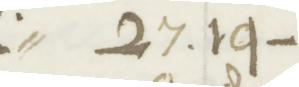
„ 27. 14 —.
